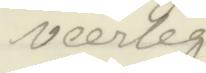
veerteg
